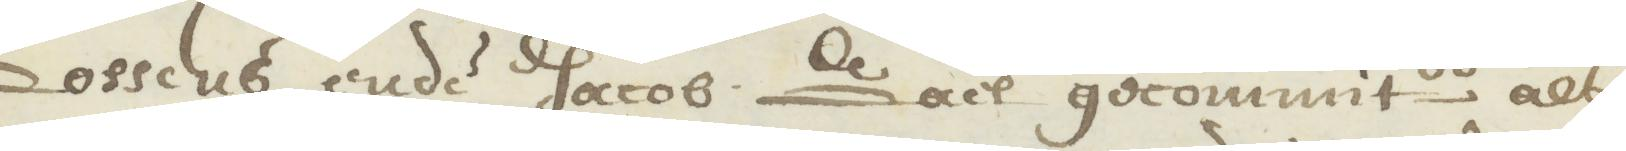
Gossens ende Jacob Gael gecommit=de als
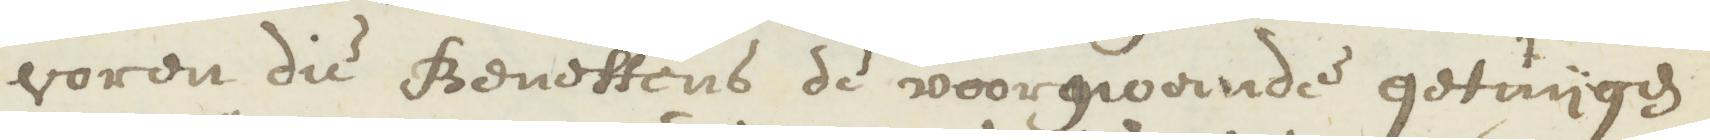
voren die Beneffens de voorgnoemde getuijgen
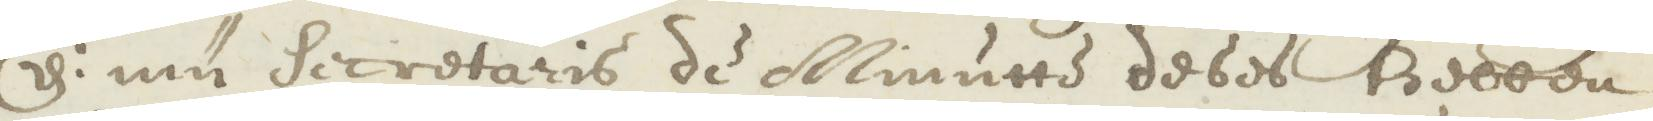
ende mij secretaris de Minutte deses hebben
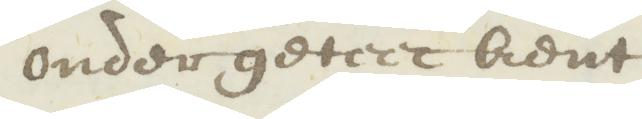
onder geteeckent
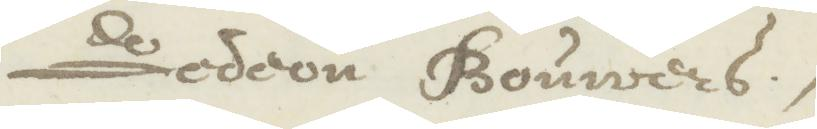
Gedeon Bouwers.
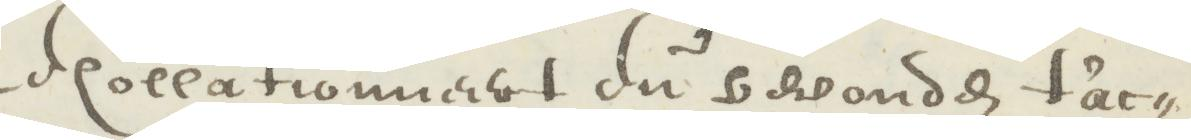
Gecollationneert en behouden t'ac„
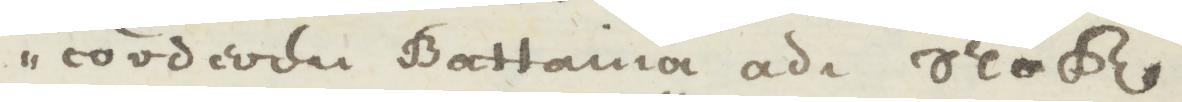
„corderen Battauia ad deo R
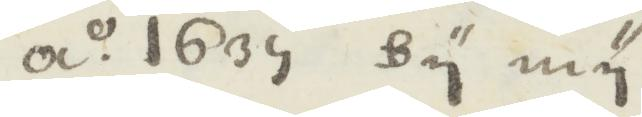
a.o 1637 bij mij
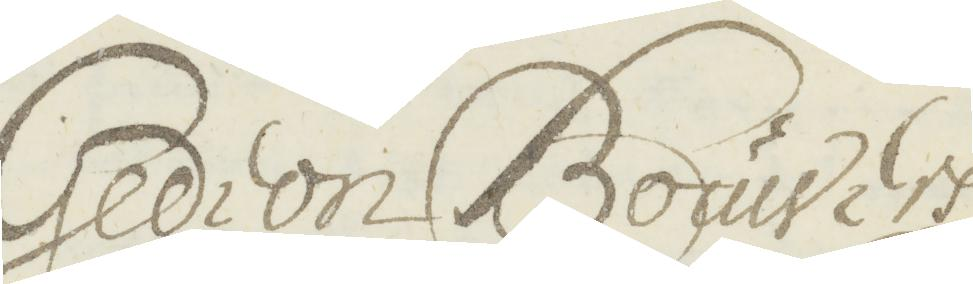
Gedeon Bouwers
